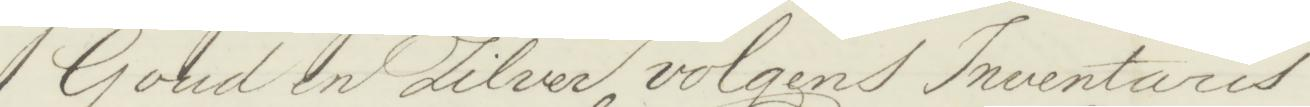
Goud en Zilver volgens Inventaris
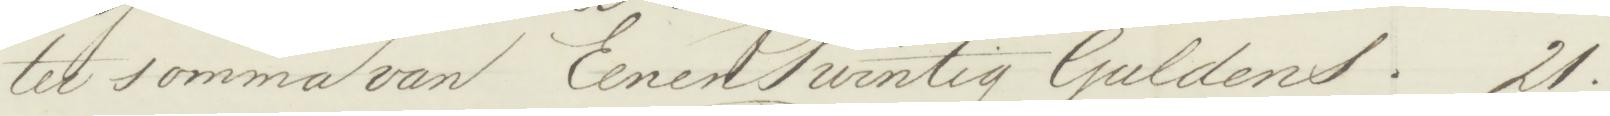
ter somma van Eenen Twintig Guldens. 21.
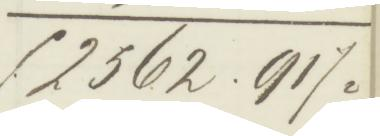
ƒ2562.91½
